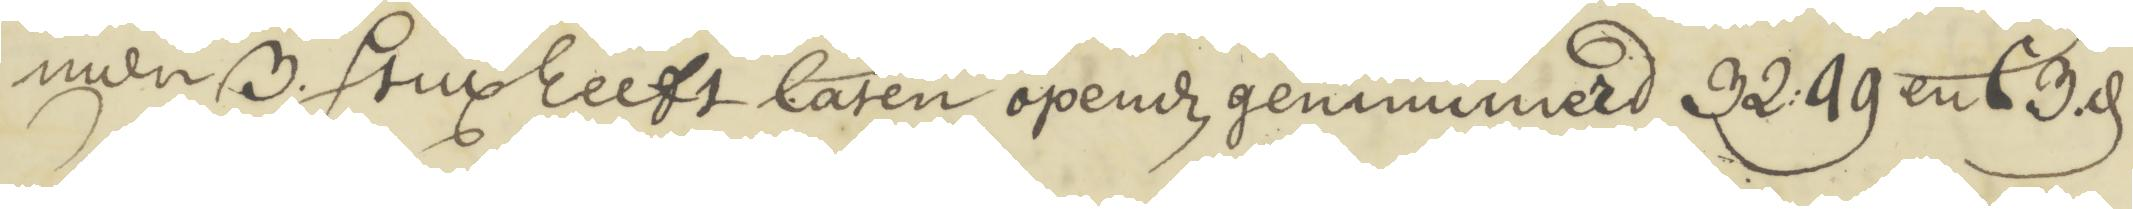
men 3. stux heeft laten openen genummerd 32: 49 en 53. en
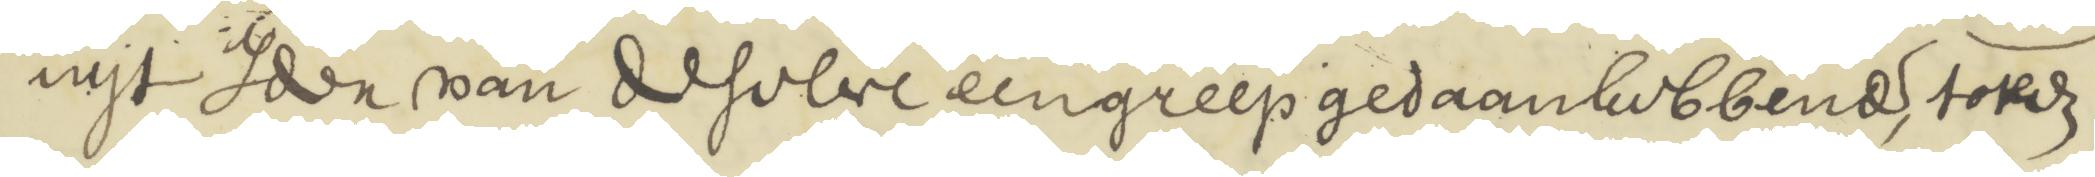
uijt Ider van deselve een greep gedaan hebbende, tot een
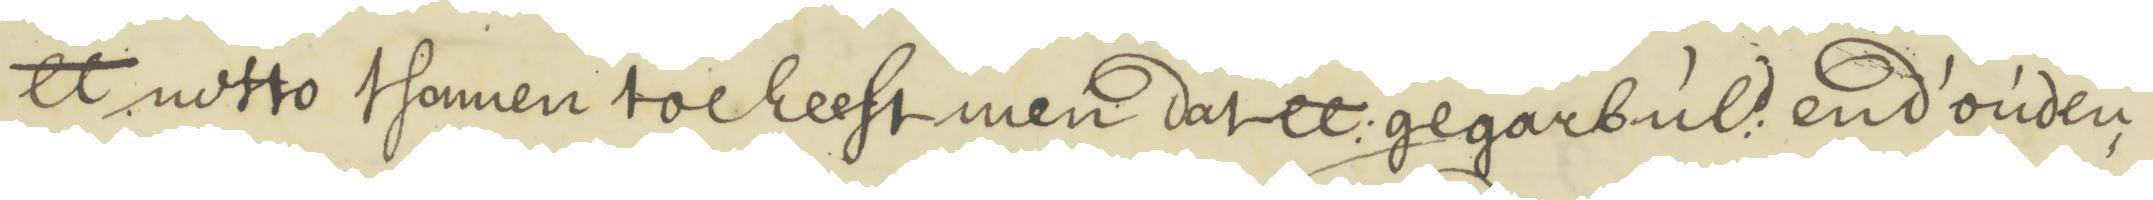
lb netto tsamen toe heeft men dat lb: gegarbul:d en d’ ouden„
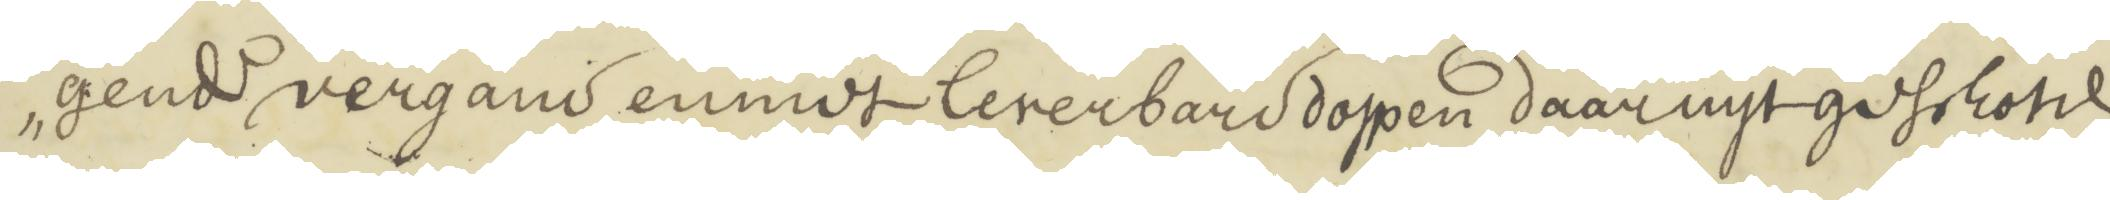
„gende vergane en niet leverbare doppen daar uijt geschoten
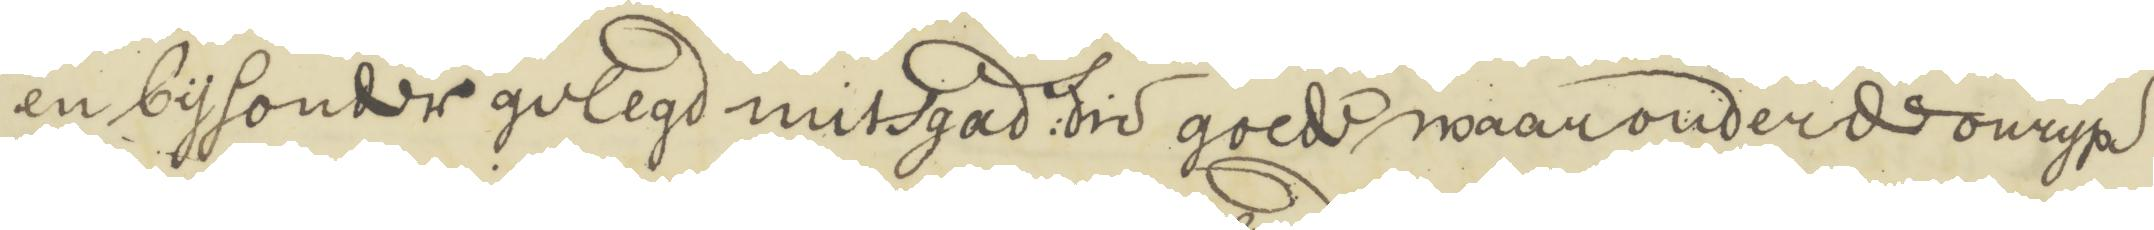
en bijsonder gelegd mitsgad:s die goede waar onder de onrijpe
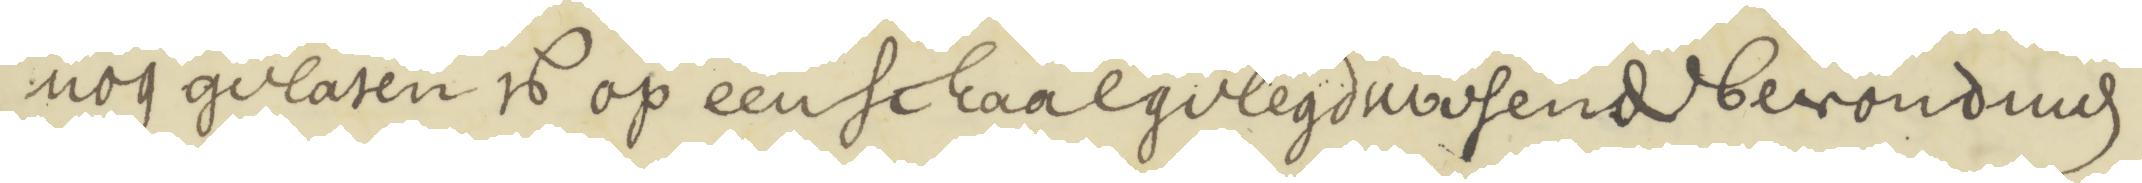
nog gelaten is op een schaal gelegd wesende bevond men
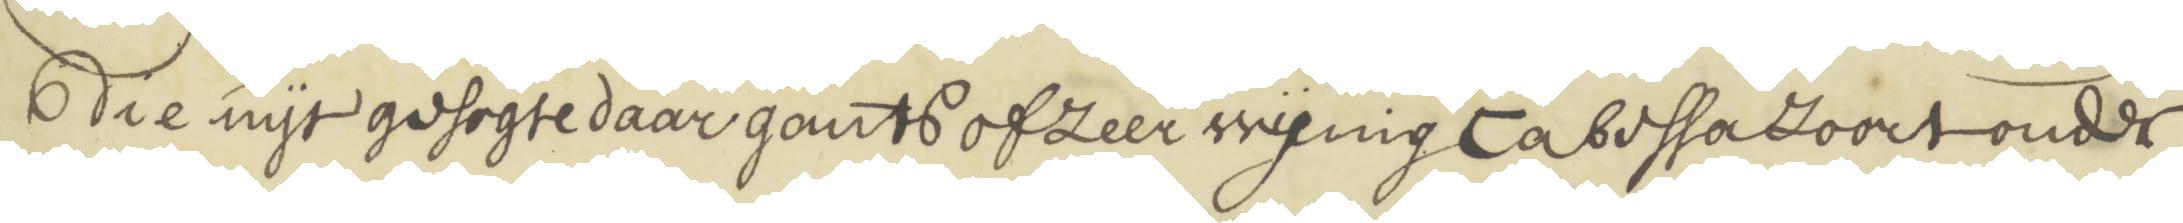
die uijt gesogte daar gants of zeer wijnig Cabessa zoort onder
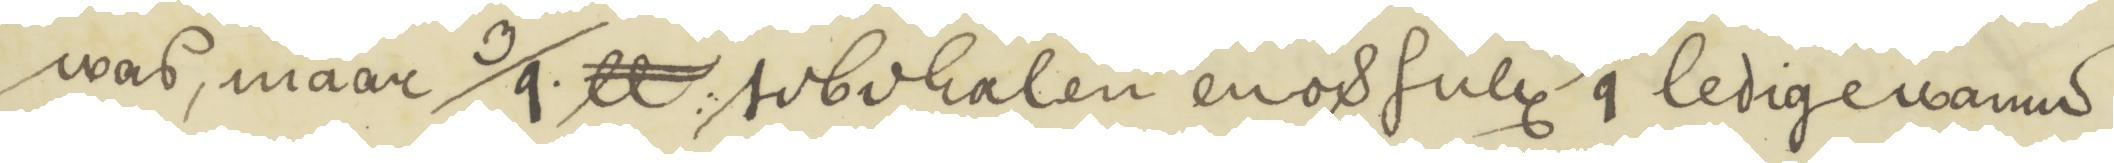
was, maar ¾. lb: te behalen en over sulx ¼ ledige wanne
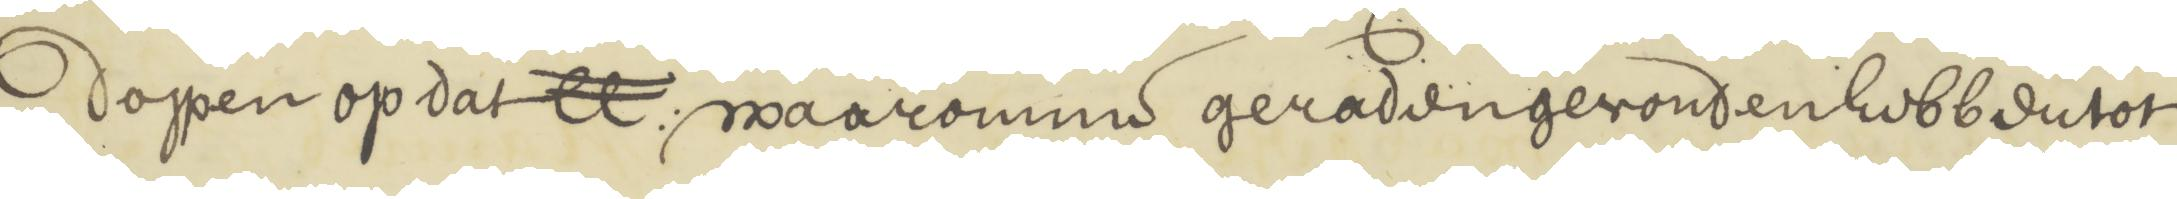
doppen op dat lb: waaromme geraden gevonden hebben tot
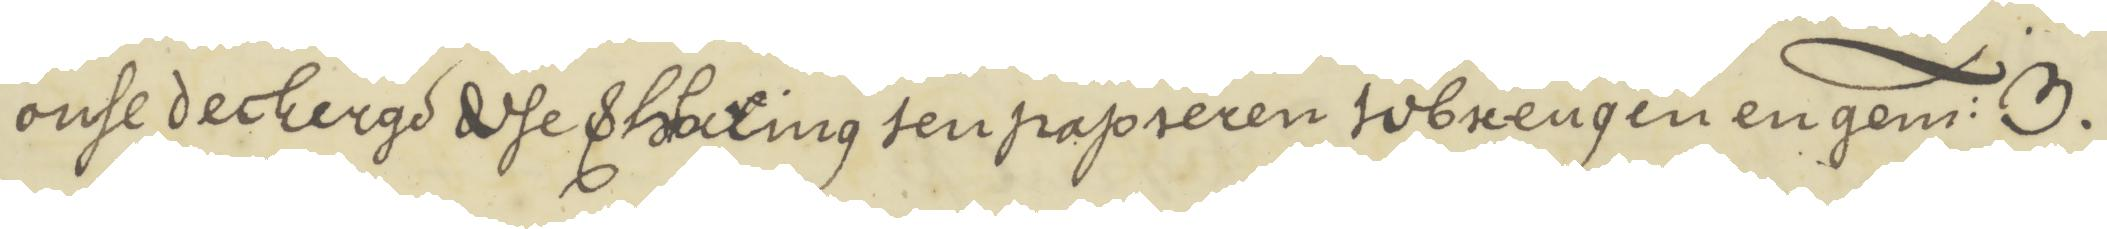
onse decherge dese verhaling ten papieren te brengen en gem: 3.
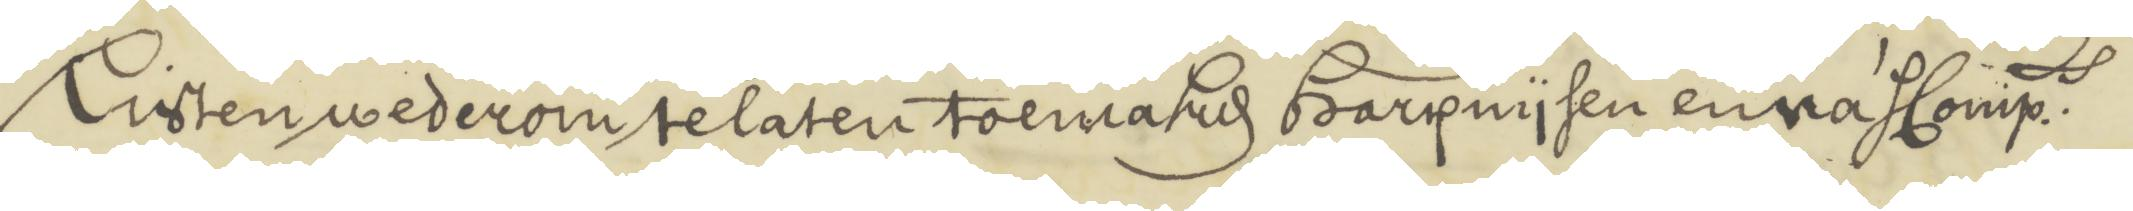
kisten wederom te laten toemaken harpuijsen en na 'sComp:s
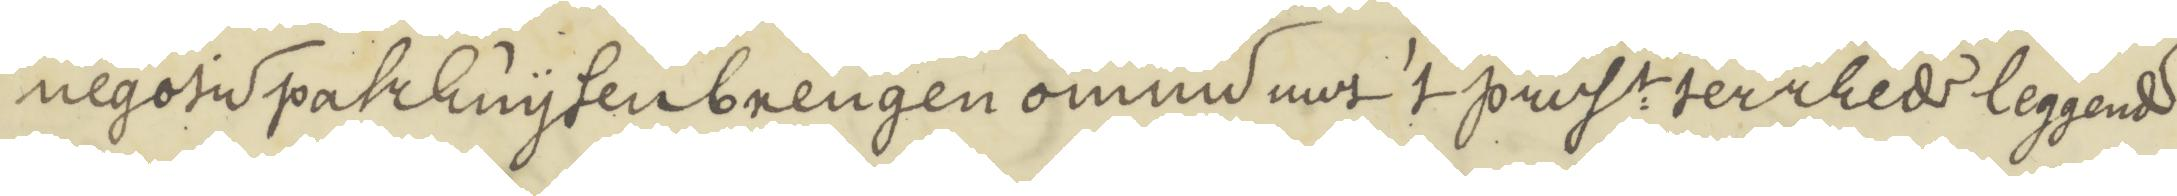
negotie pakhuijsen brengen omme met ’t pres:t ter rhede leggende
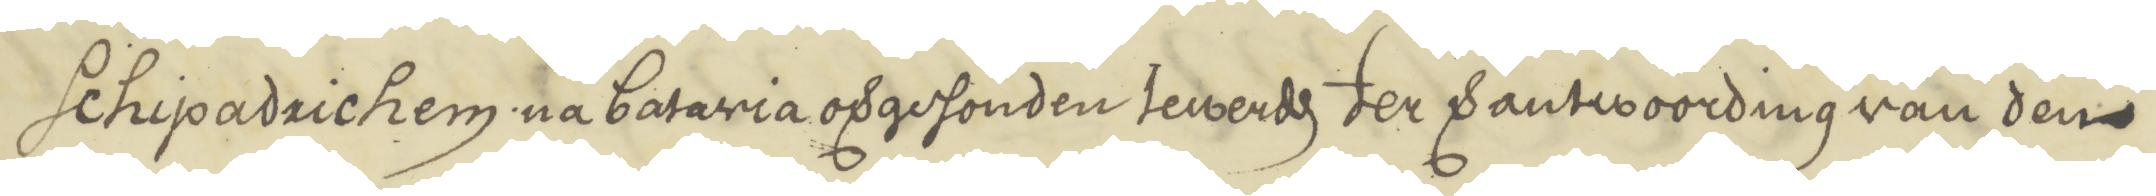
schip adrichem na batavia overgesonden te werden der verantwoording van den
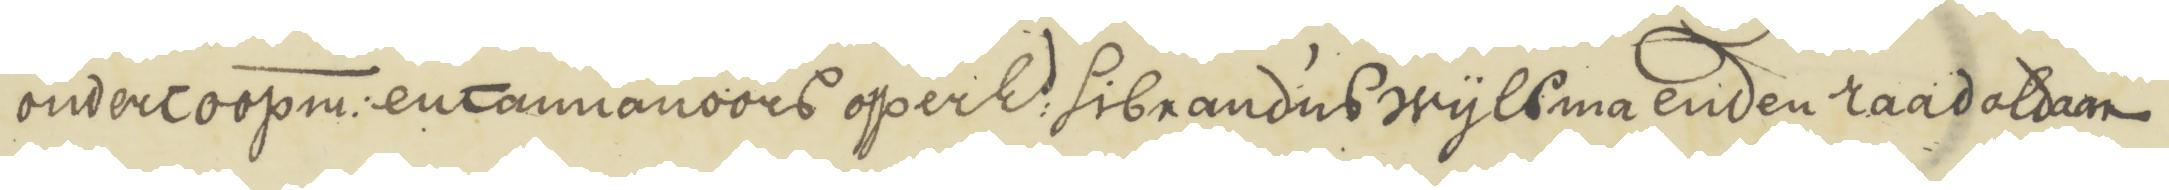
ondercoopm: en cannanoors opperh:d sibrandus wijlsma en den raad aldaar
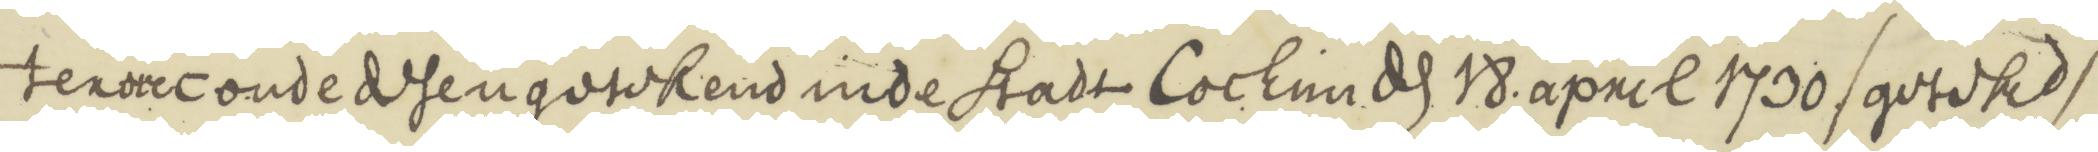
ter oirconde desen getekend inde stadt Cochim den 18. april 1730 / getekd /
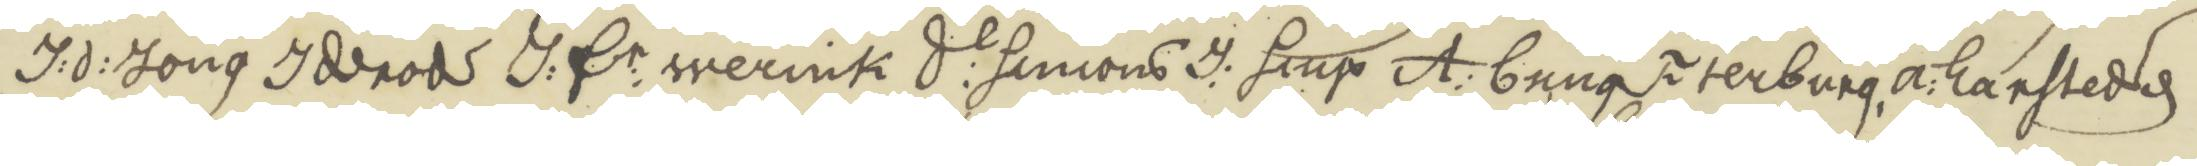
I: d: Iong I derode I: f:r wernik d:l simons I: snip A: brug F terburg, a: harstede en
